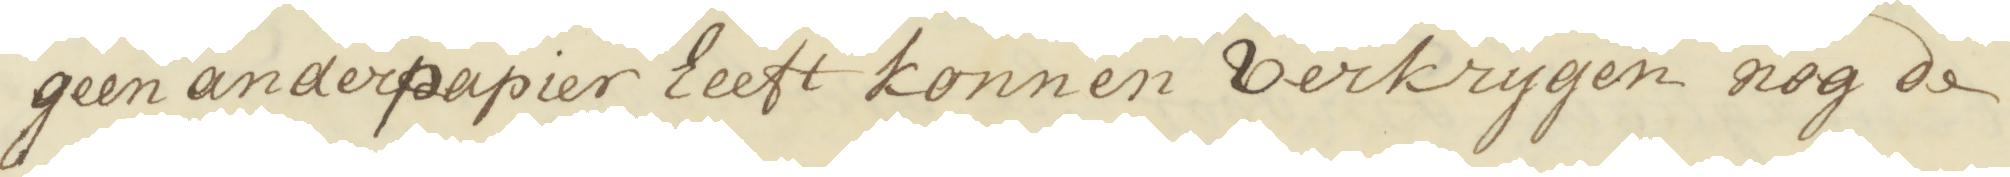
geen ander papier heeft konnen Verkrygen nog de
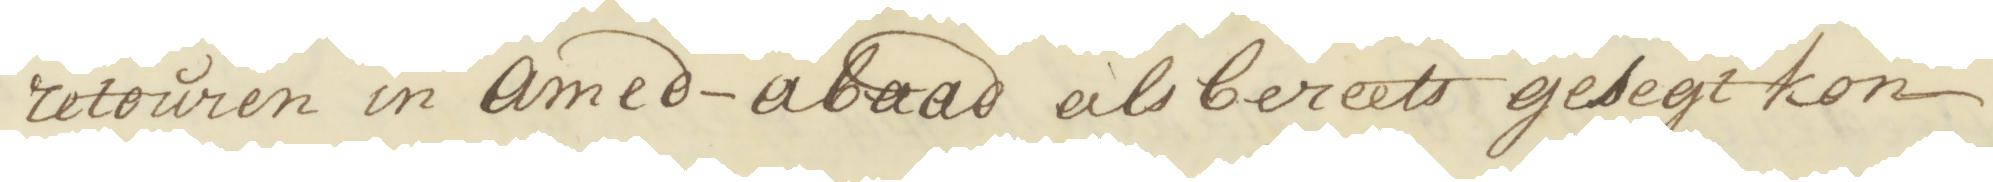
retouren in Amed-abaad als bereets gesegt kon
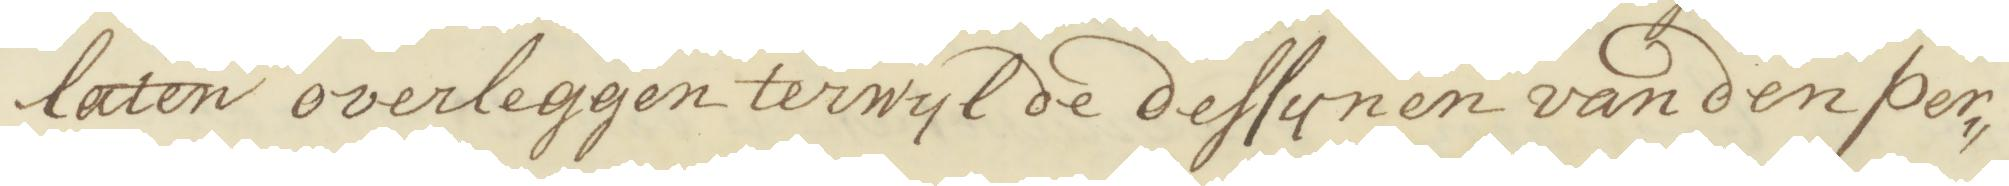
laten overleggen terwyl de dessynen van den per„
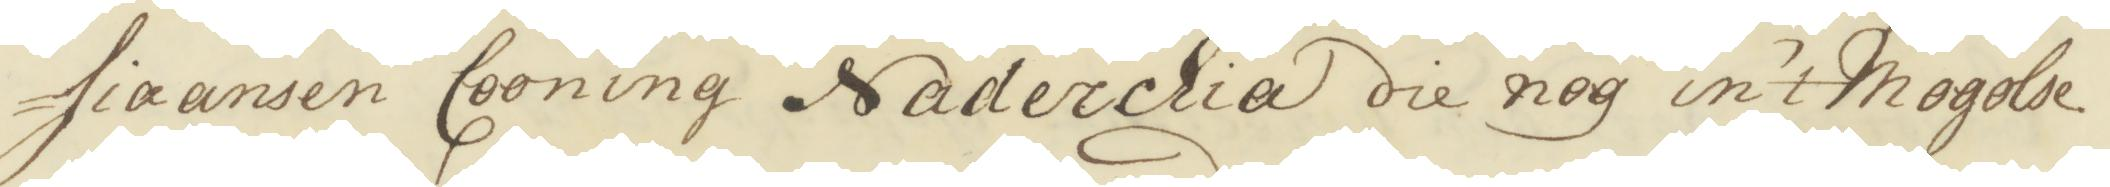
siaansen Cooning Naderchia die nog in ’t Mogolse
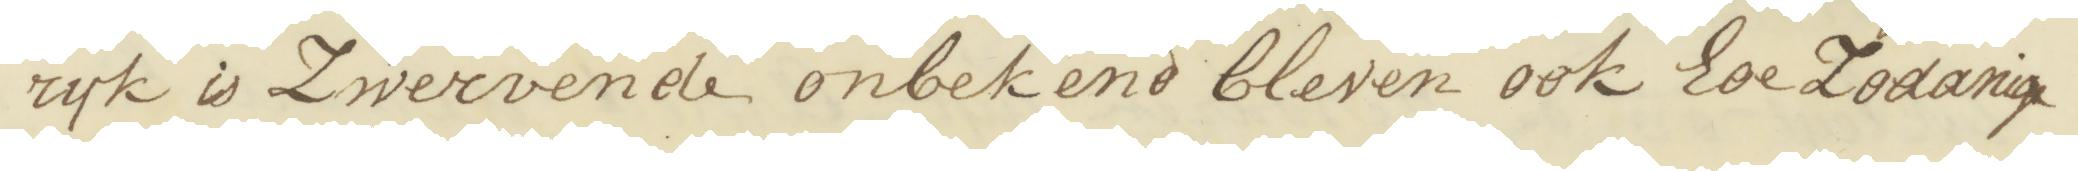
ryk is zwervende onbekend bleven ook hoe zodanig
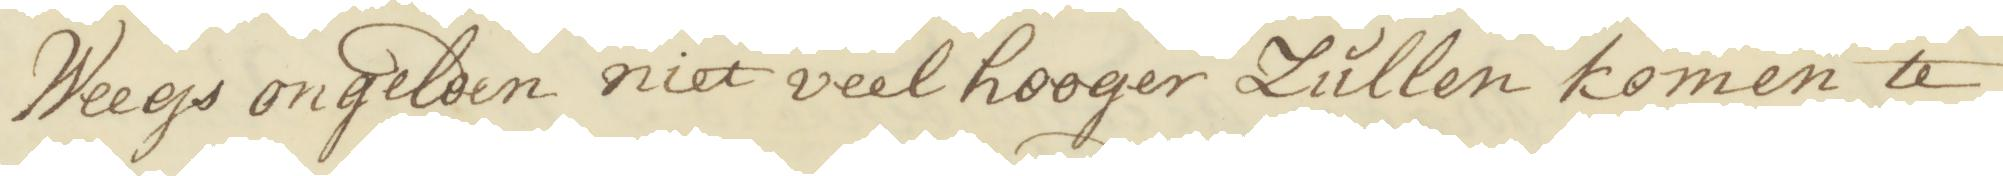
Weegs ongelden niet veel hooger zullen komen te
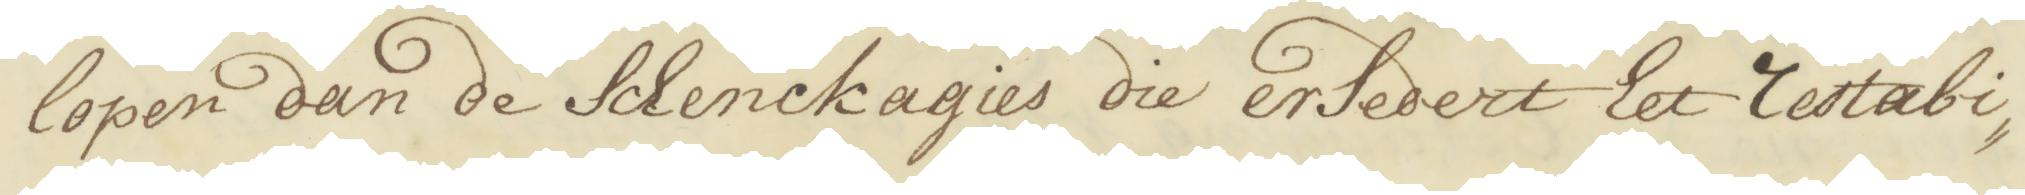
lopen dan de schenckagies die er sedert het restabi„
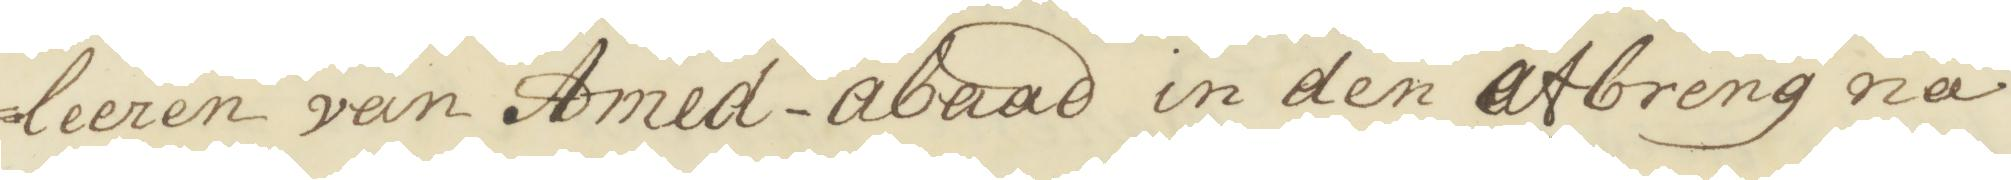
„leeren van Amed-abaad in den afbreng na
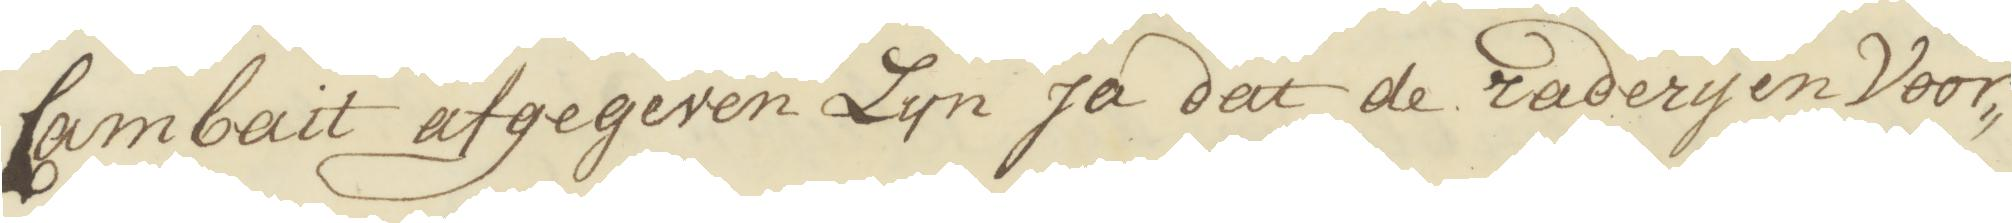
Cambait afgegeven zyn ja dat de raderyen Voor„
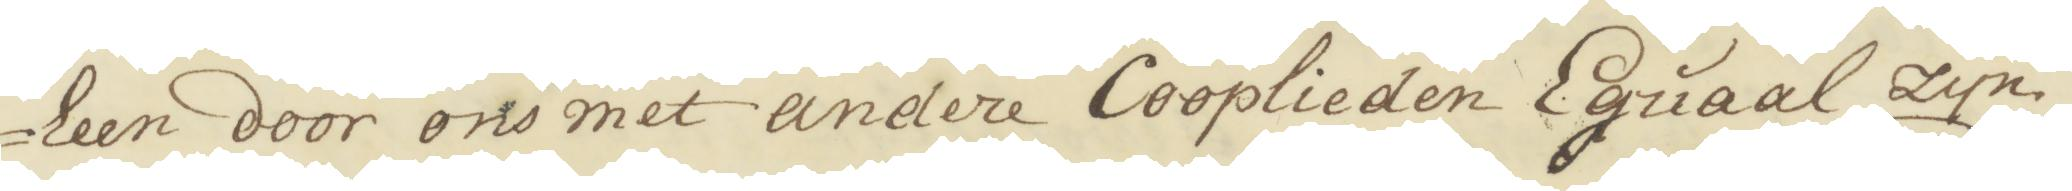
=heen door ons met andere Cooplieden Eguaal zyn
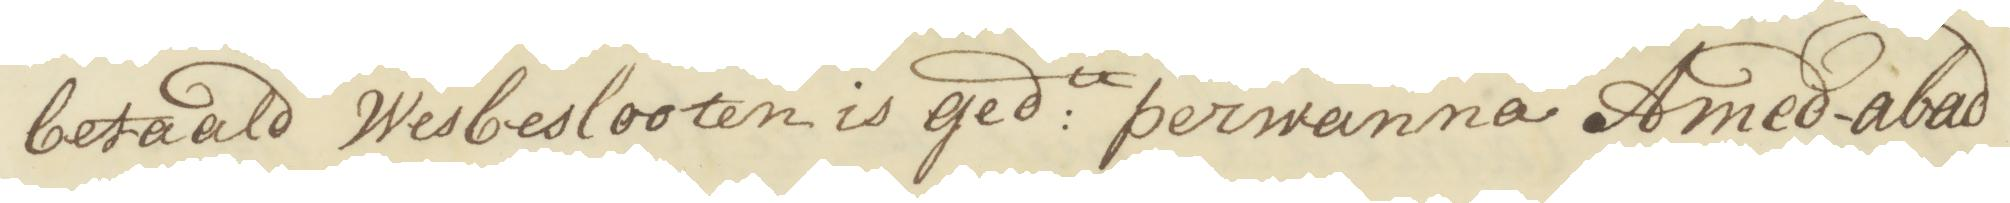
betaald Wesbeslooten is ged:te Perwanna Amed-abad
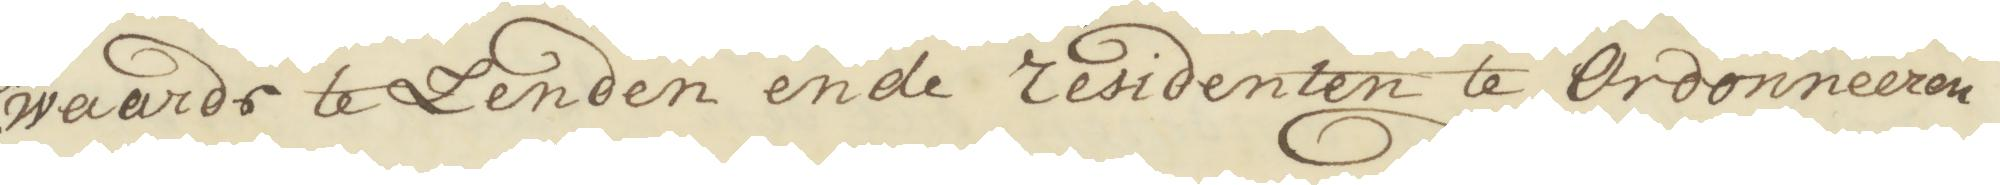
waards te zenden ende Residenten te Ordonneeren
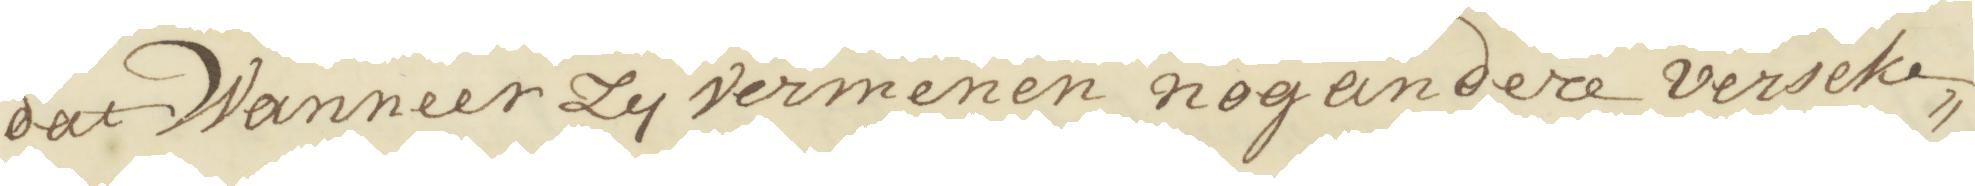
dat Wanneer zy vermenen nog andere verseke„
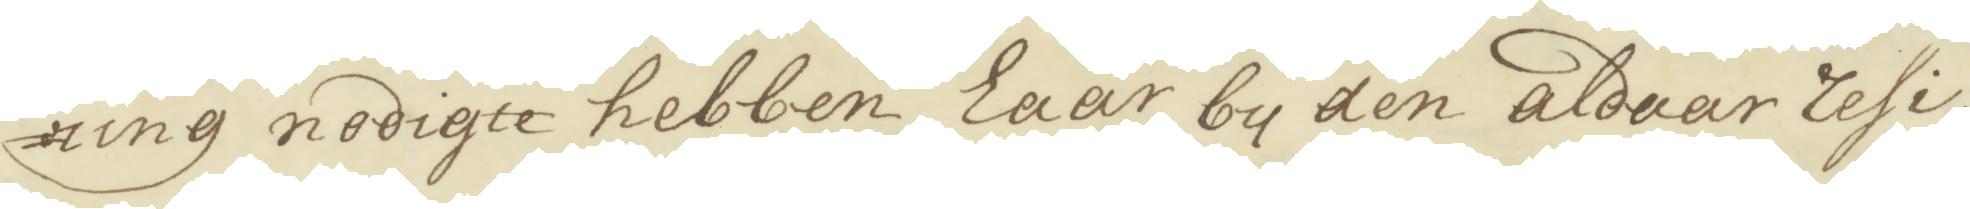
=ring nodigte hebben haar by den aldaar resi„
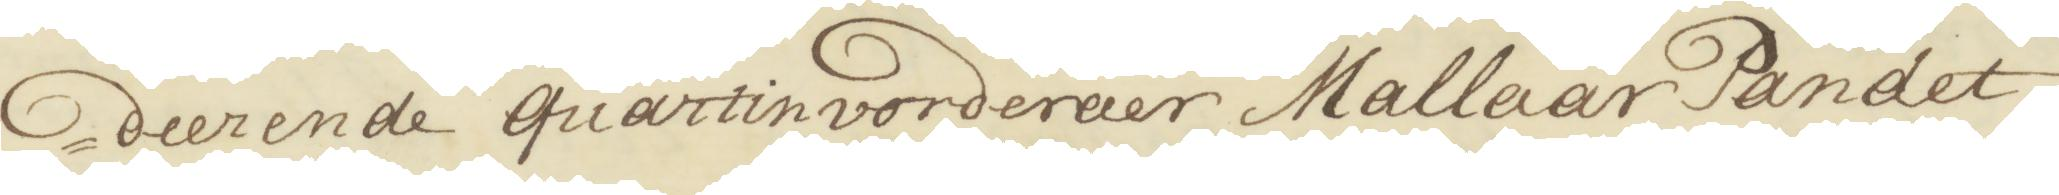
=deerende quartin vorderaer Mallaar Pandet
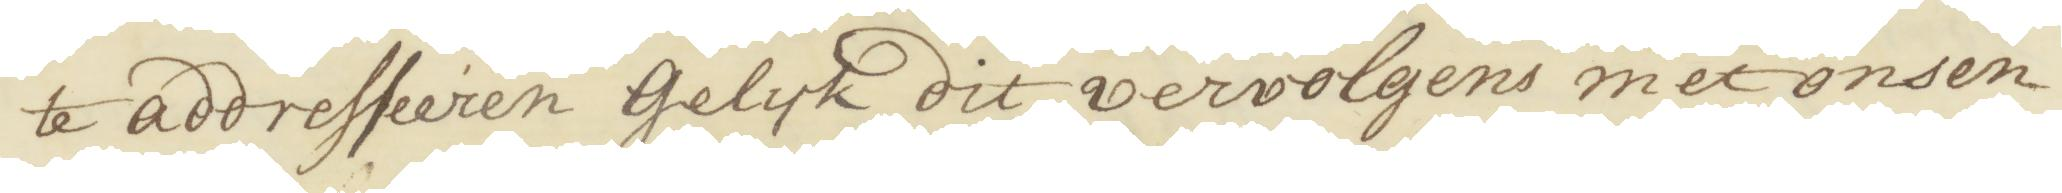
te addresseeren Gelyk dit vervolgens met onsen
